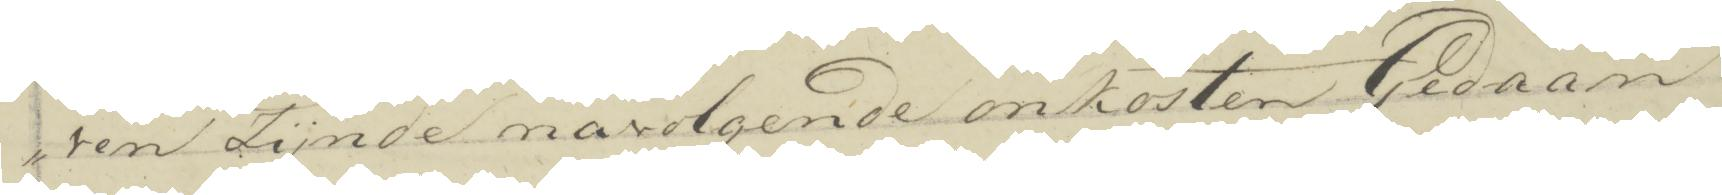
„ven Zijnde navolgende onkosten Gedaan
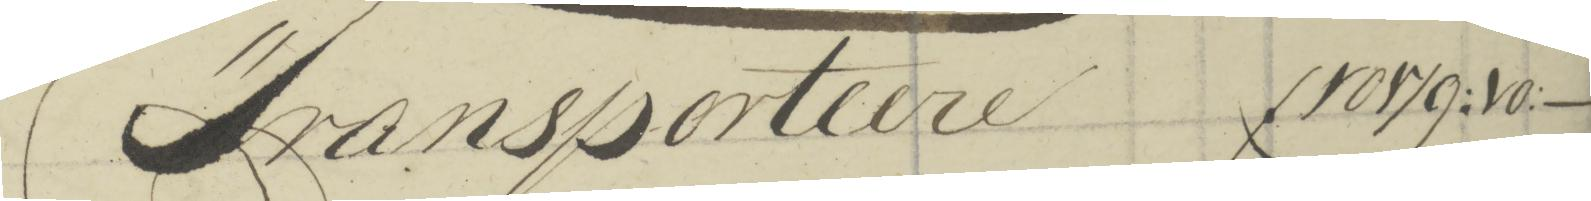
Transporteere ƒ10179:10:—
